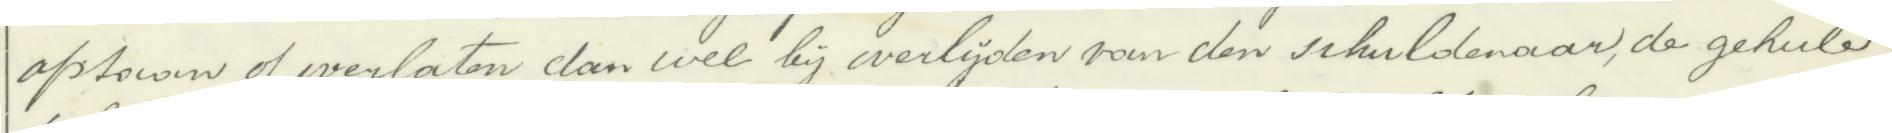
afstaan of overlaten dan wel bij overlijden van den schuldenaar, de geheele
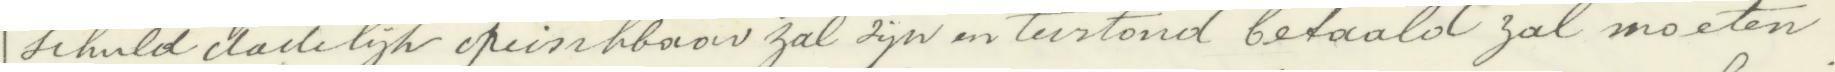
schuld dadelijk opeischbaar zal zijn en terstond betaald zal moeten
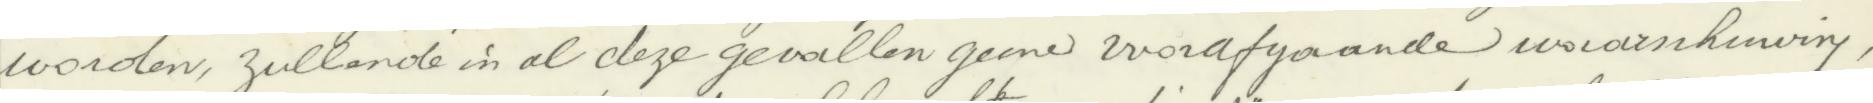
worden, zullende in al deze gevallen geene voorafgaande waarschuwing
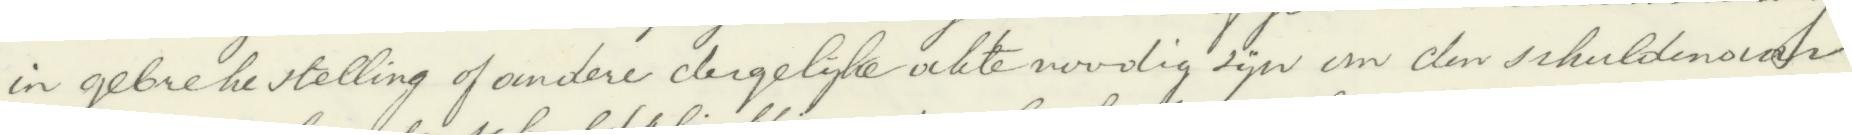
in gebreke stelling of andere dergelijke akte noodig zijn om den schuldenaar
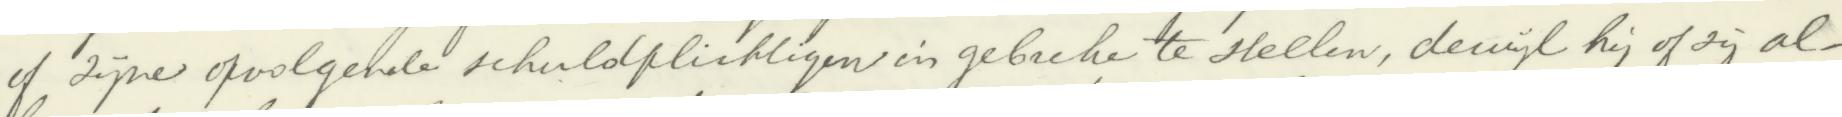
of zijne opvolgende schuldplichtigen in gebreke te stellen, dewijl hij of zij al-
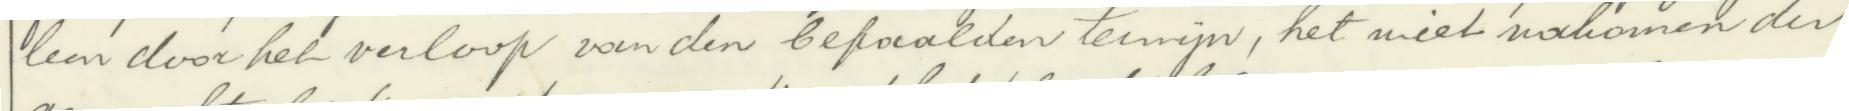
leen door het verloop van den bepaalden termijn, het niet nakomen der
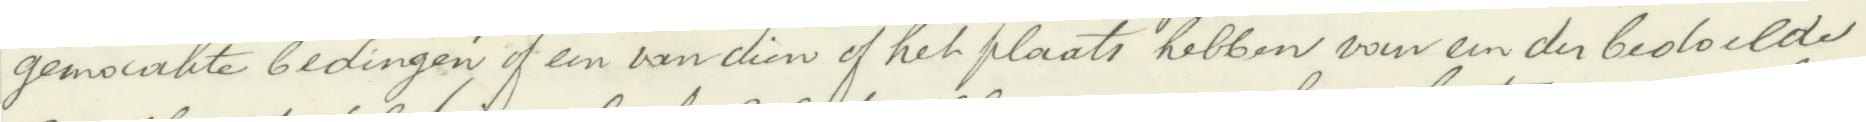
gemaakte bedingen of een van dien of het plaats hebben van een der bedoelde
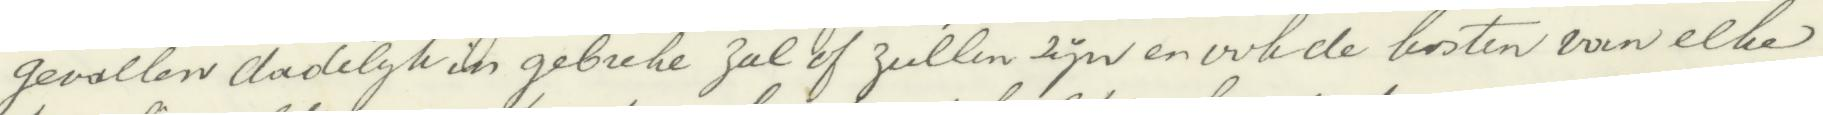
gevallen dadelyk in gebreke zal of zullen zijn en ook de kosten van elke
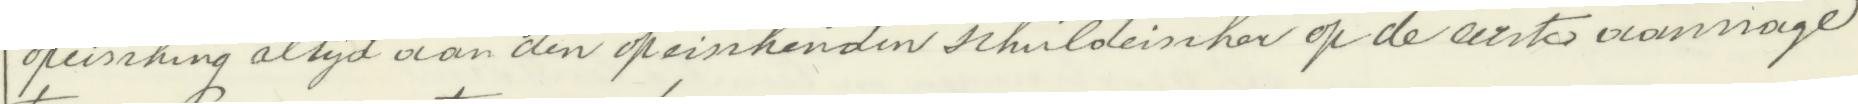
opeisching altijd aan den opeischenden schuldeischer op de eerste aanvrage
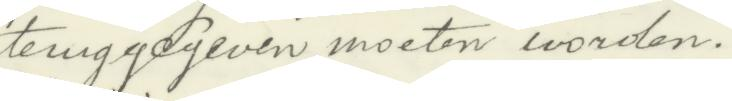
teruggegeven moeten worden.
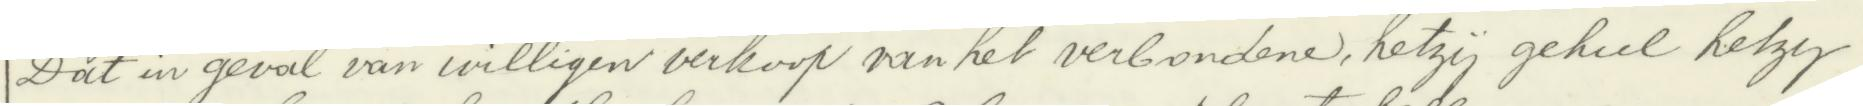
Dat in geval van willigen verkoop van het verbondene, hetzij geheel hetzy
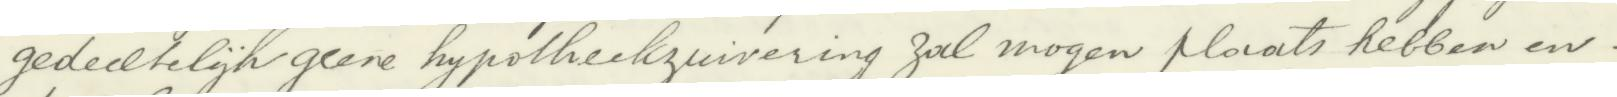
gedeeltelijk geene hypotheekzuivering zal mogen plaats hebben en
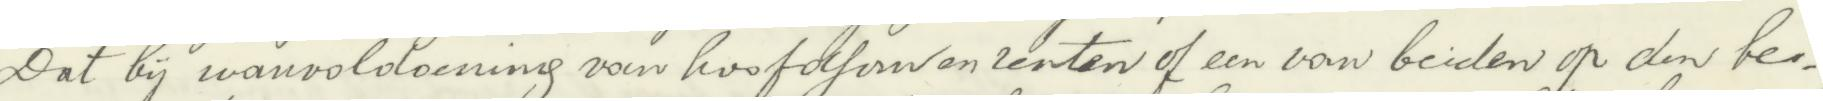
Dat bij wanvoldoening van hoofdsom en renten of een van beiden op den be-
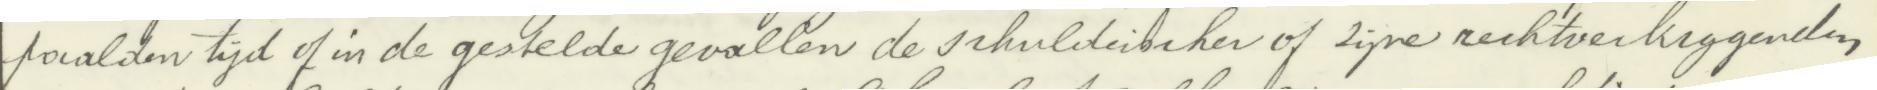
paalden tijd of in de gestelden gevallen de schuldeischer of zijne rechtverkrygenden
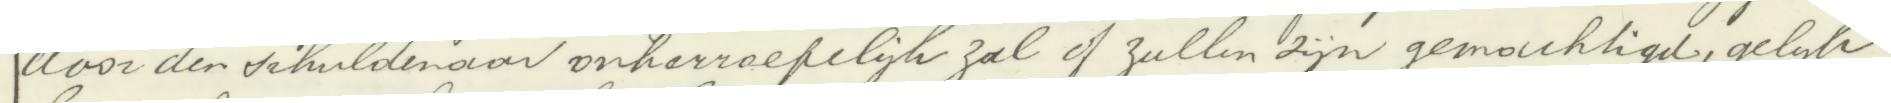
door den schuldenaar onherroepelijk zal of zullen zijn gemachtigd, gelyk
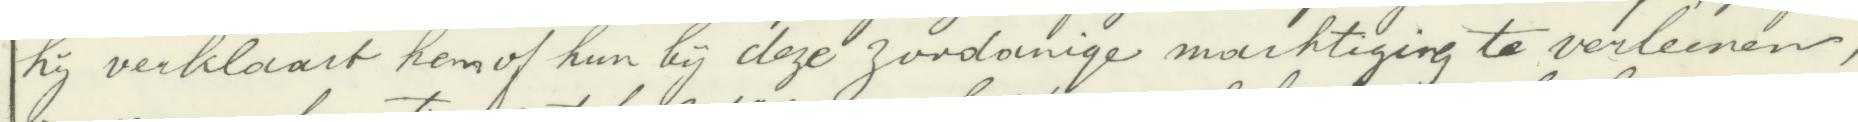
hij verklaart hem of hun bij deze zoodanige machtiging te verleenen
